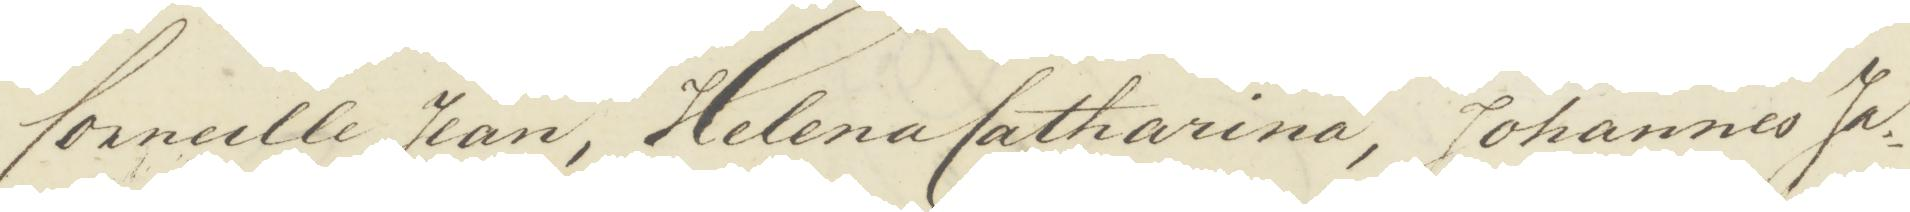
Corneille Jean, Helena Catharina, Johannes Ja=
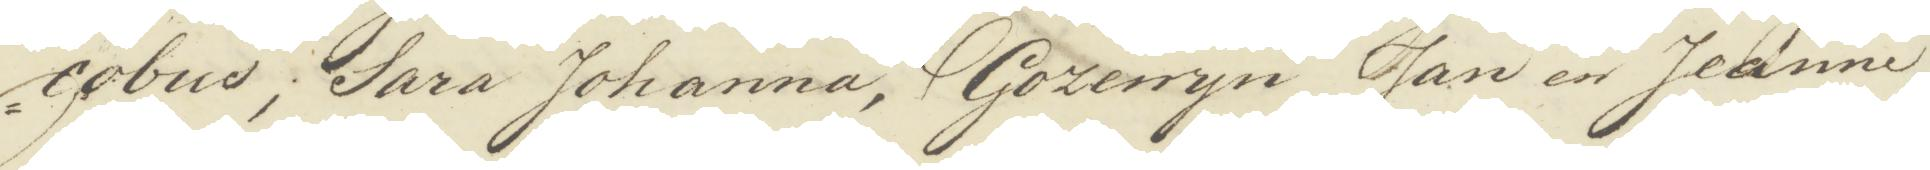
=cobus, Sara Johanna, Gozewyn Jan en Jeanne
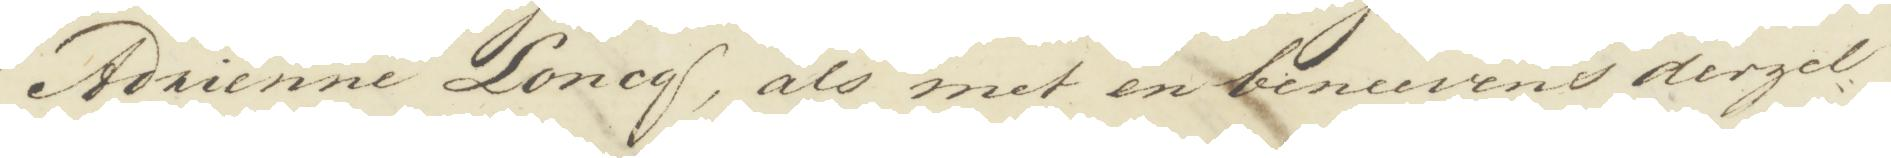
Adrienne Loncq, als met en beneevens derzel„
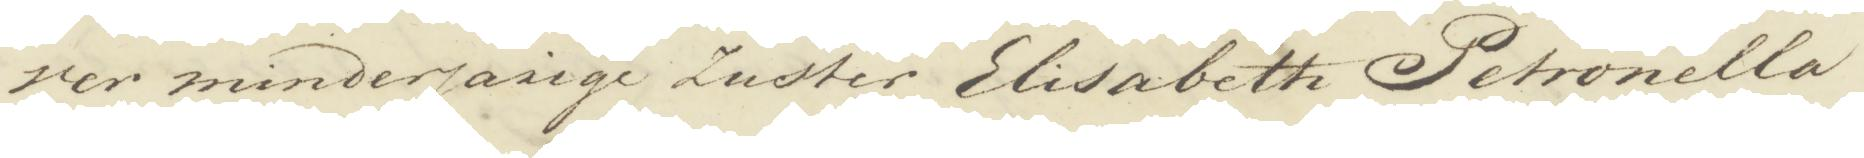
ver minderjarige zuster Elisabeth Petronella
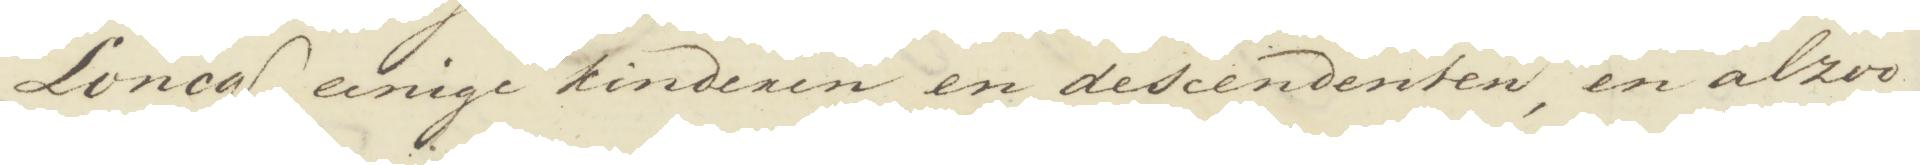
Loncq eenige kinderen en descendenten, en alzoo
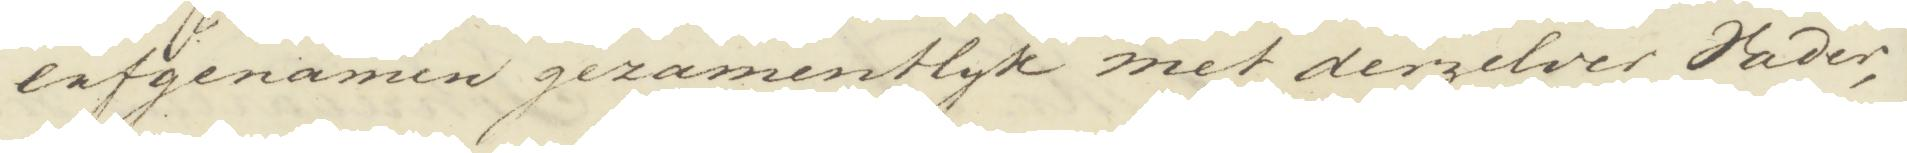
erfgenamen gezamentlyk met derzelver Vader,
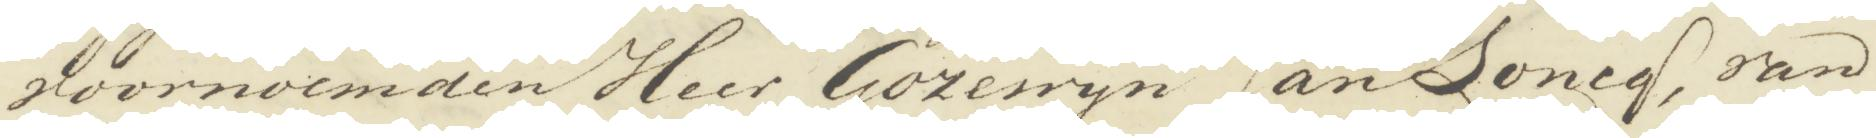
voornoemden Heer Gozewyn Jan Loncq, van
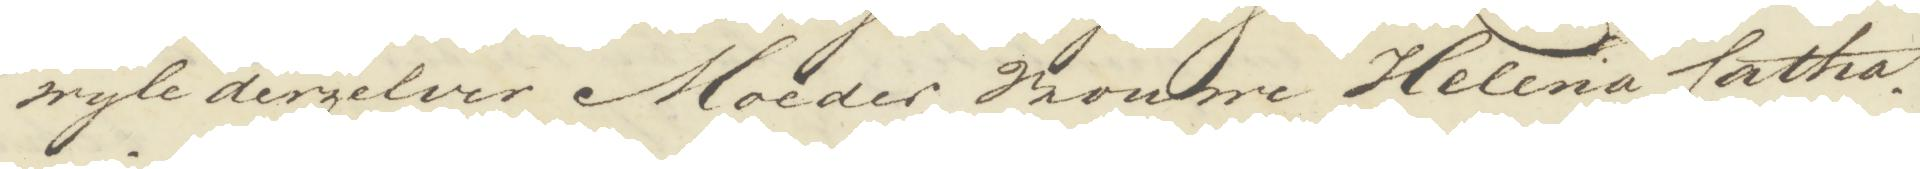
wyle derzelver Moeder Vrouwe Helena Catha.
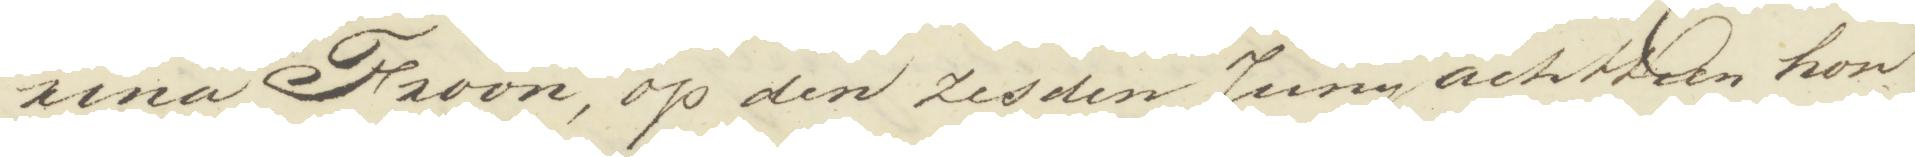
rina Froon, op den zesden Juny achttien hon
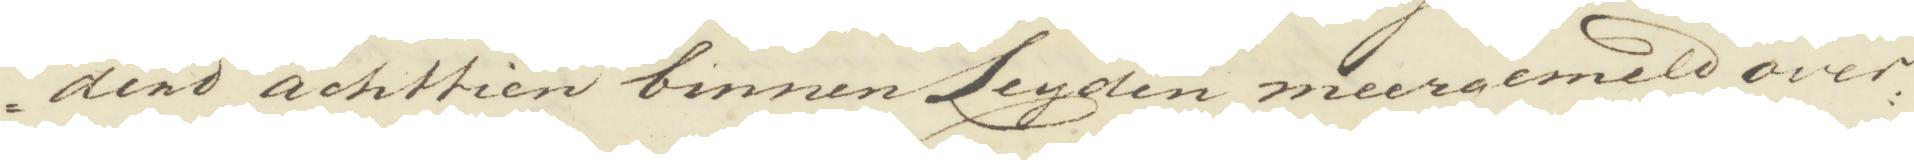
=derd achttien binnen Leyden meergemeld over:
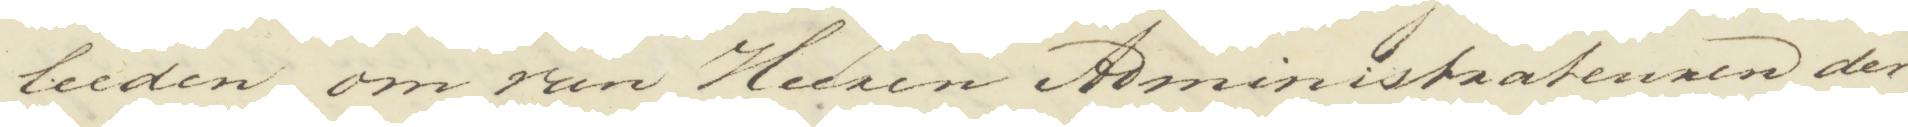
leeden, om van Heeren Administrateuren der
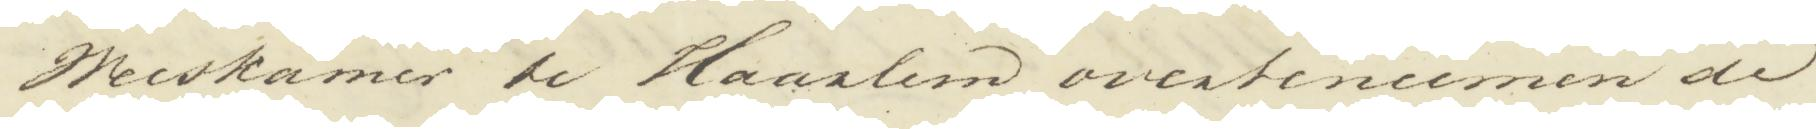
Weeskamer te Haarlem overteneemen de
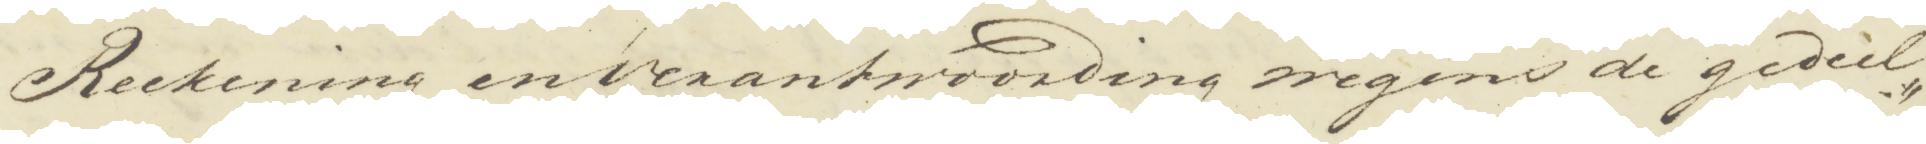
Reekening en verantwoording wegens de gedeel„
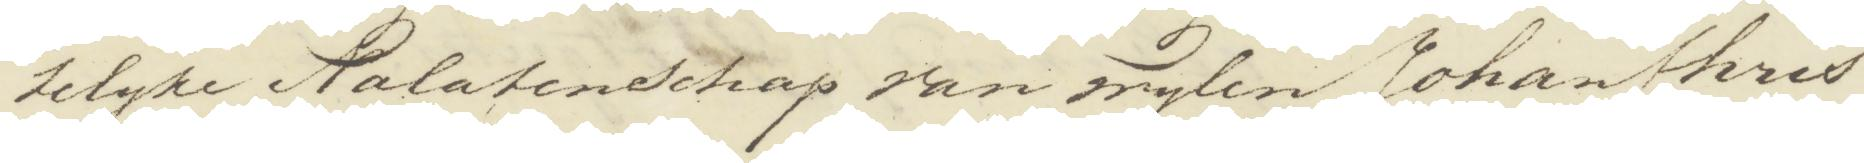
telyke Nalatenschap van wylen Johan Chris
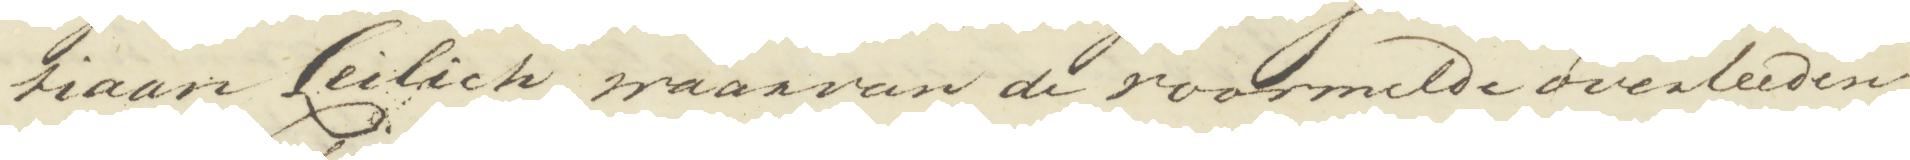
tiaan Leilich, waarvan de voormelde overleeden
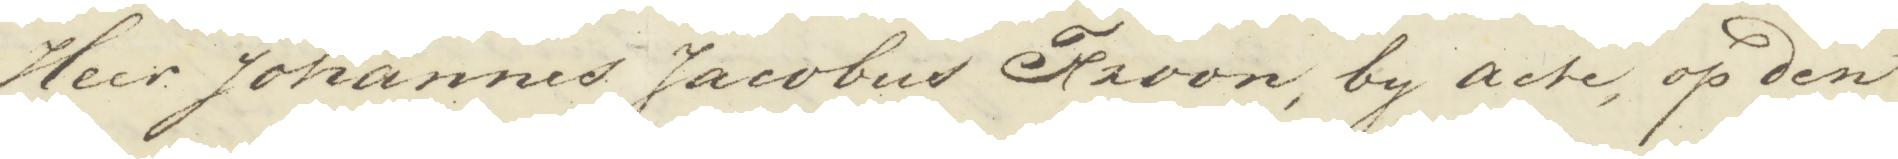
Heer Johannes Jacobus Froon, by acte, op den
